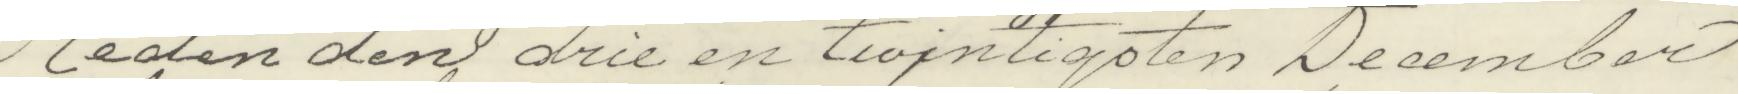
Heden den drie en twintigsten December
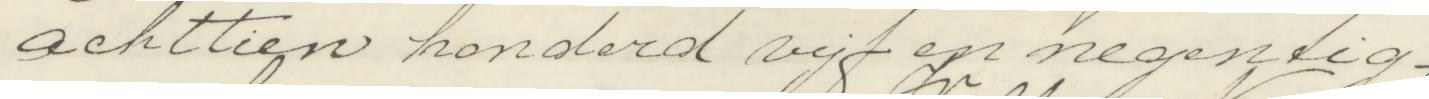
achttien honderd vijf en negentig
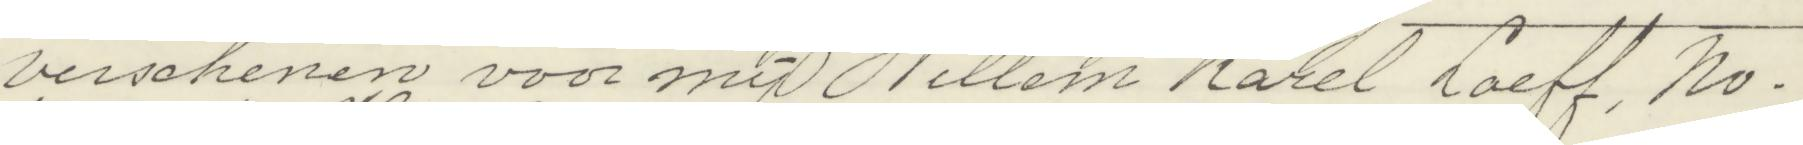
verschenen voor mij Willem Karel Loeff, No-
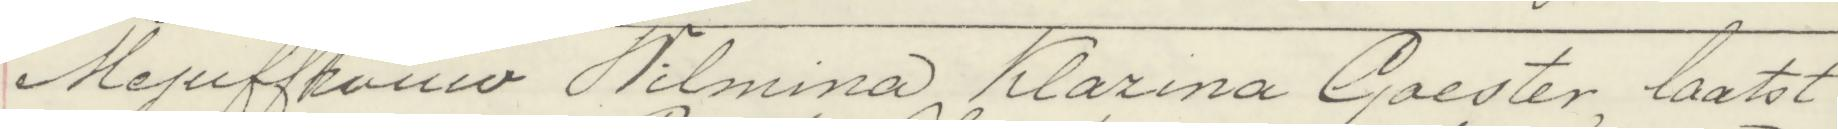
Mejufrouw Wilmina Klazina Goester, laatst
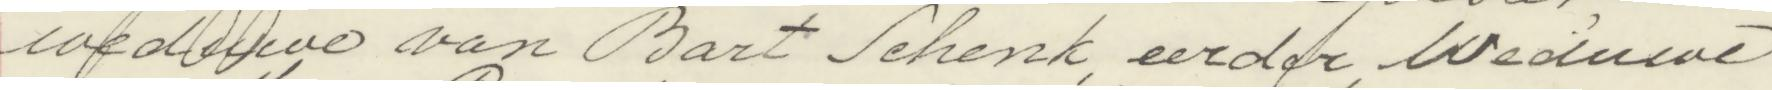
weduwe van Bart Schenk, eerder weduwe
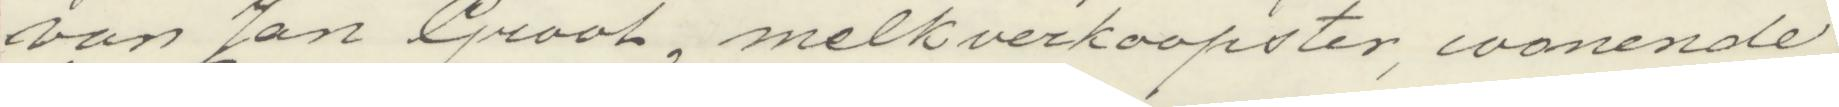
van Jan Groot, melkverkoopster, wonende
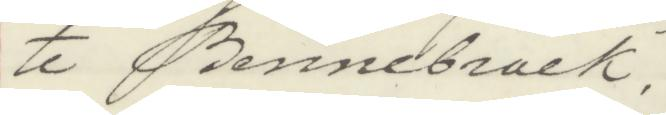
te Bennebroek,
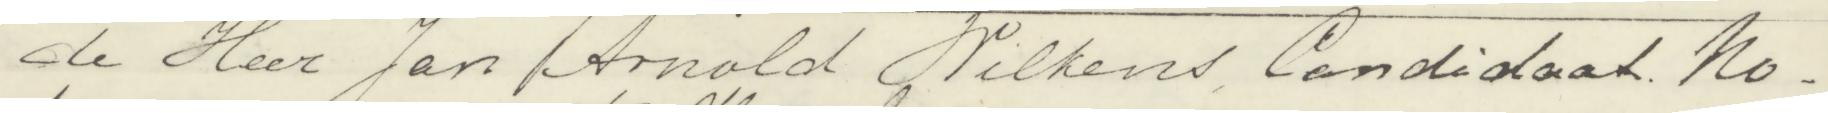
de Heer Jan Arnold Wilkens, Candidaat. No-
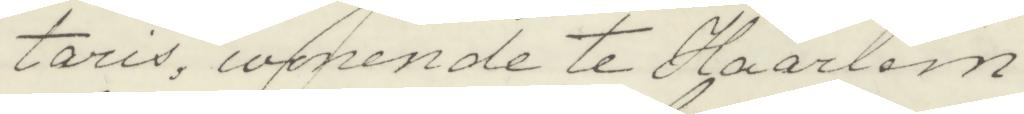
taris, wonende te Haarlem
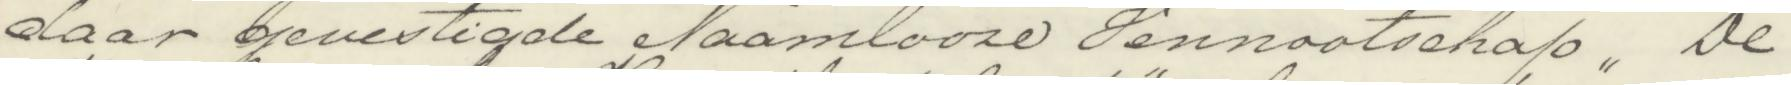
daar gevestigde Naamlooze Vennootschap „ De
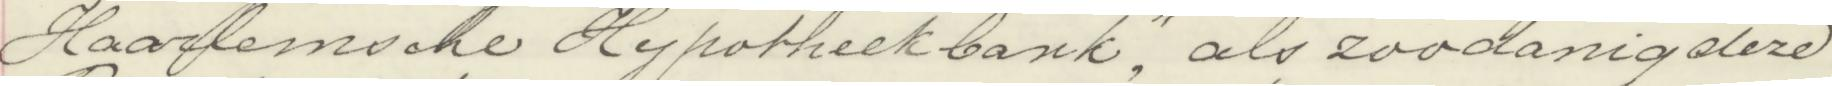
Haarlemsche Hypotheekbank," als zoodanig deze
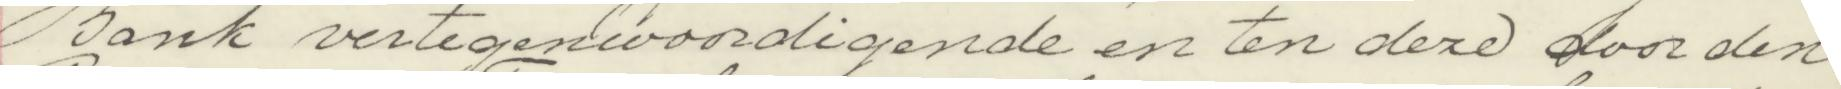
Bank vertegenwoordigende en ten deze door den
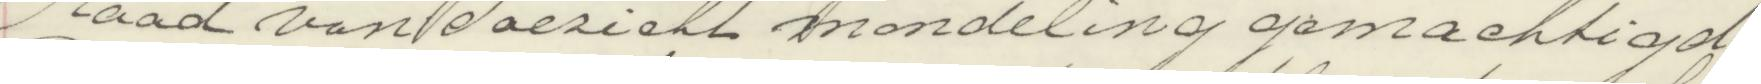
Raad van Toezicht mondeling gemachtigd.
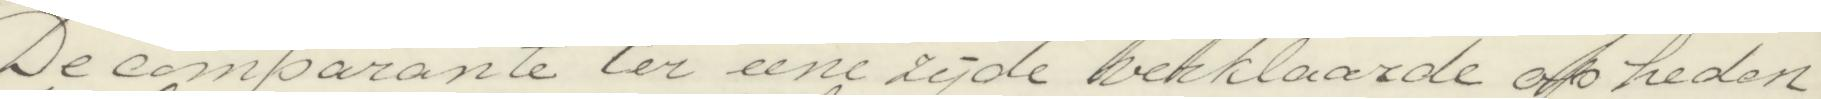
De comparante ter eene zijde verklaarde op heden
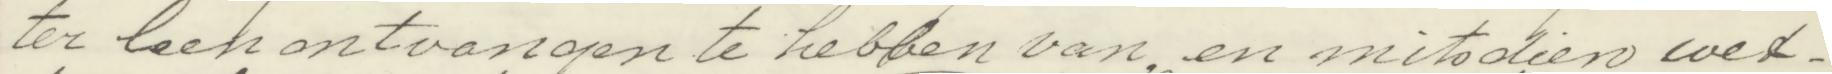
ter leen ontvangen te hebben van en mitsdien wet-
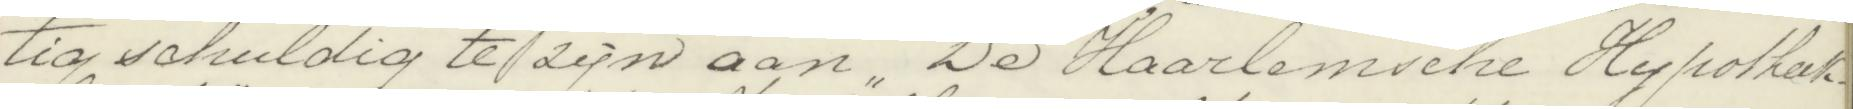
tig schuldig te zijn aan „ De Haarlemsche Hypotheek
